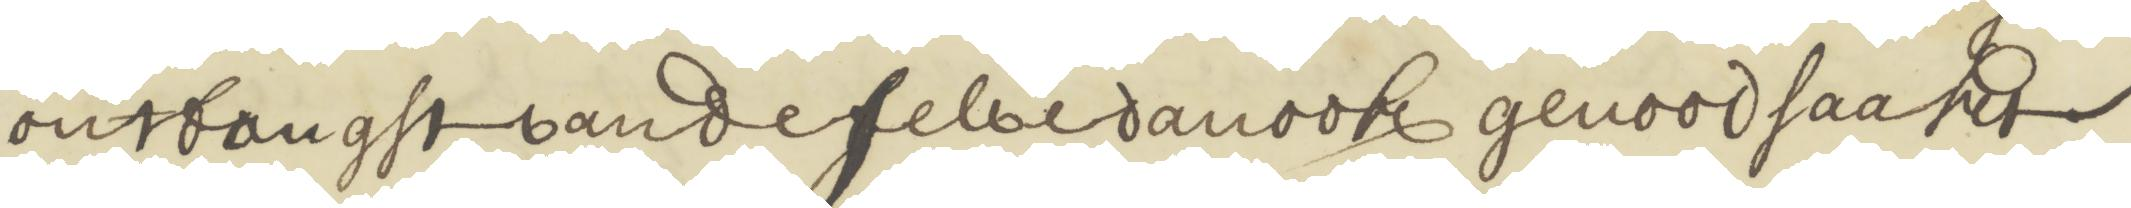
ontfangst van deselve dan ook genoodsaakt
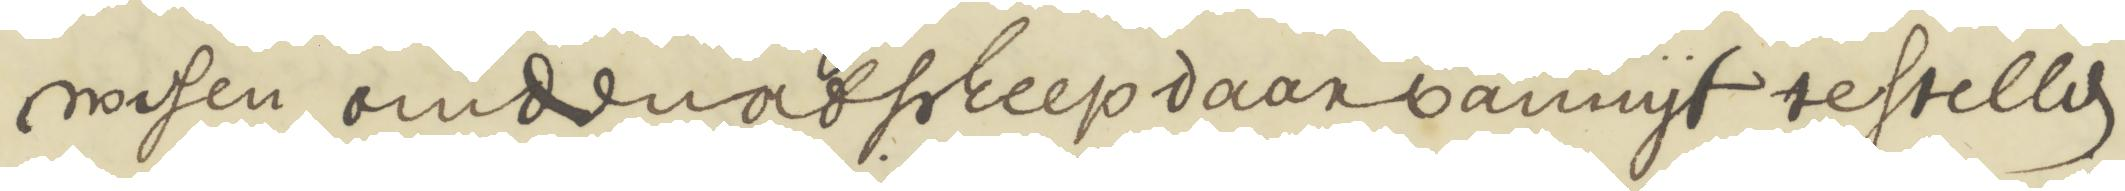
wesen om den afscheep daarvanuijt te stellen
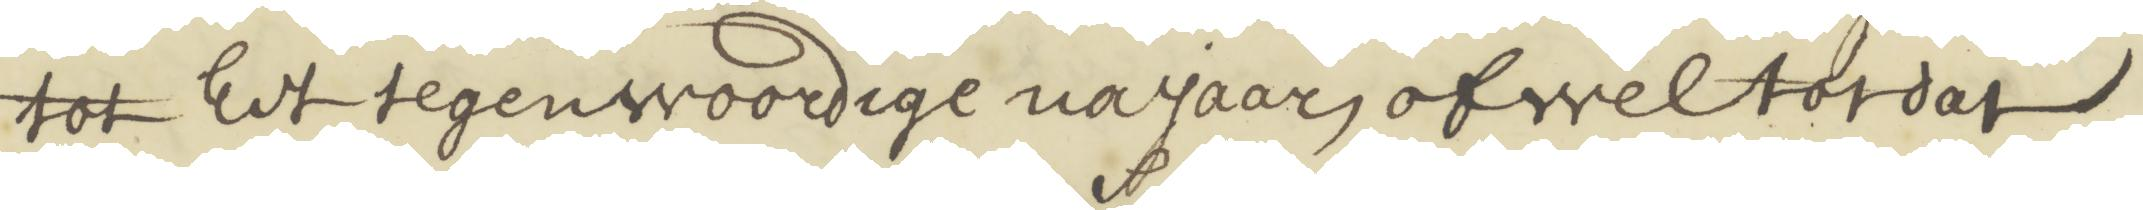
tot het tegenwoordige najaar, of wel totdat
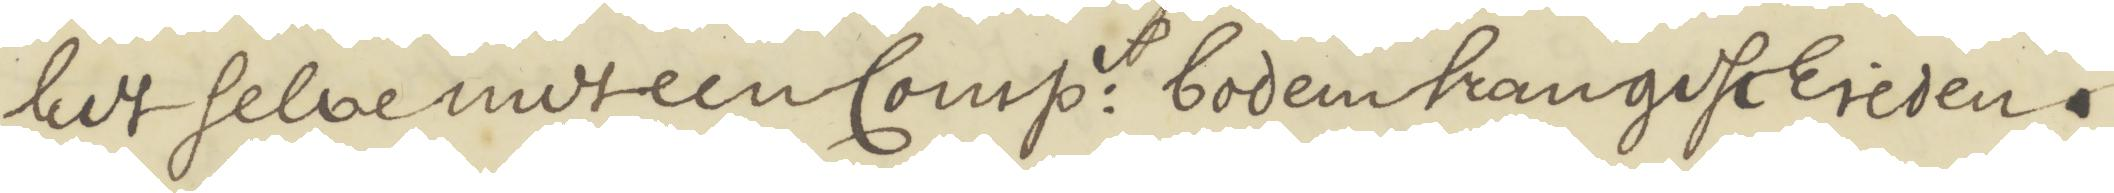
het selve met een Comp:s bodem kan geschieden.
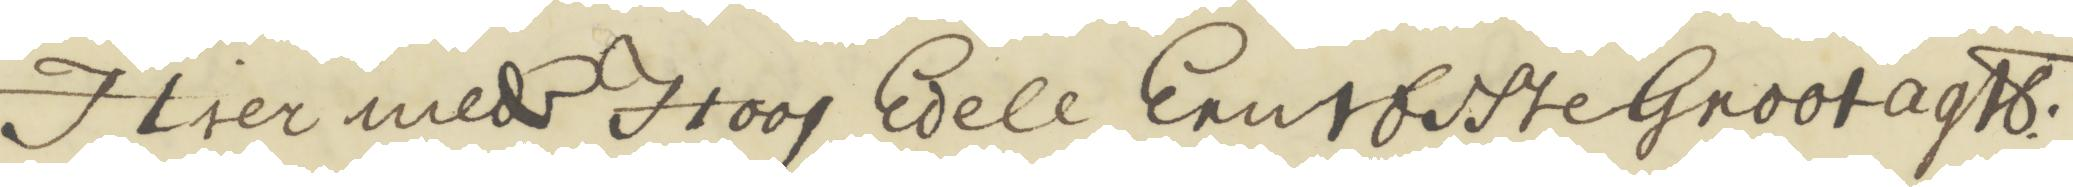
Hier mede Hoog Edele Erntfeste groot agtb:
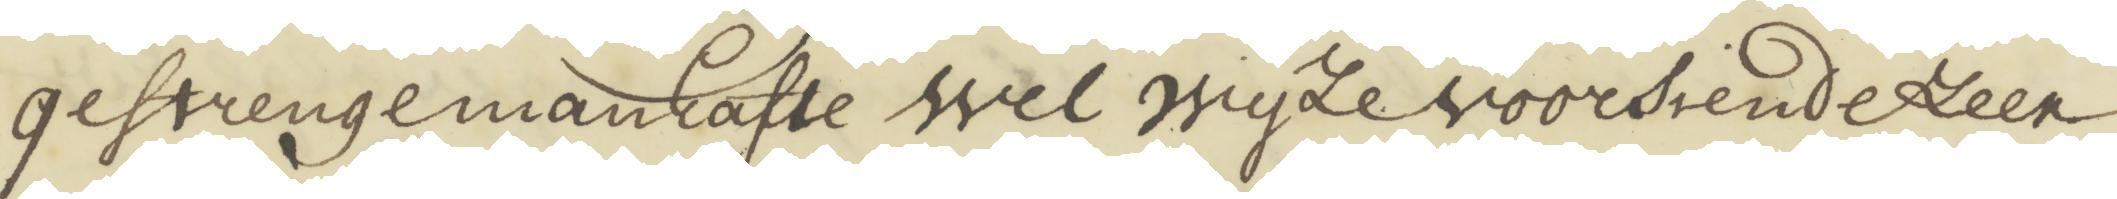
gestrenge manhafte wel wijze voorsiende zeer
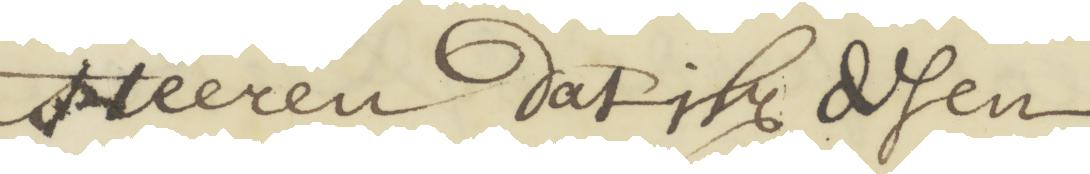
Heeren dat ik desen
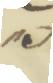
„Haar„
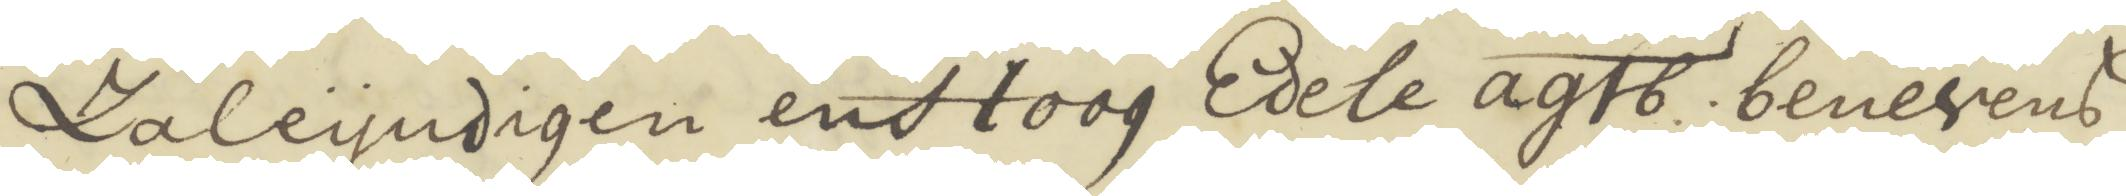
Zal eijndigen en Hoog Edele agtb: benevens
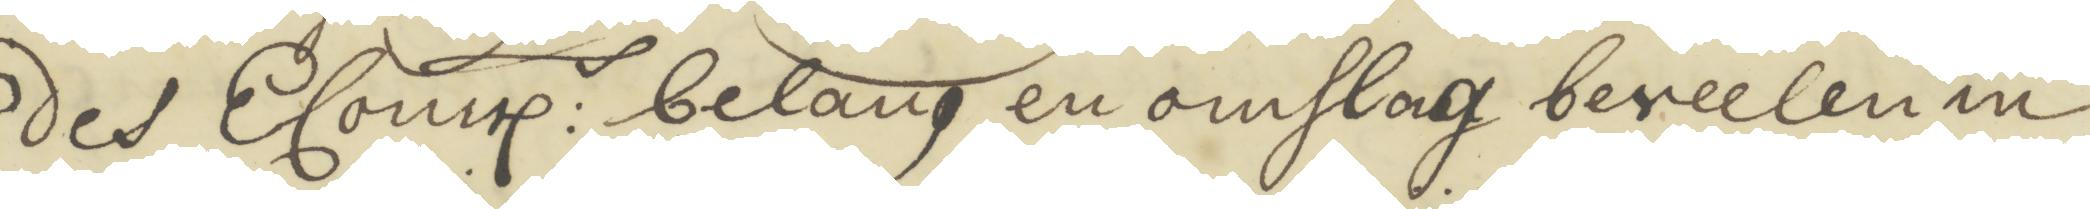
des EComp:s belang en omslag beveelen in
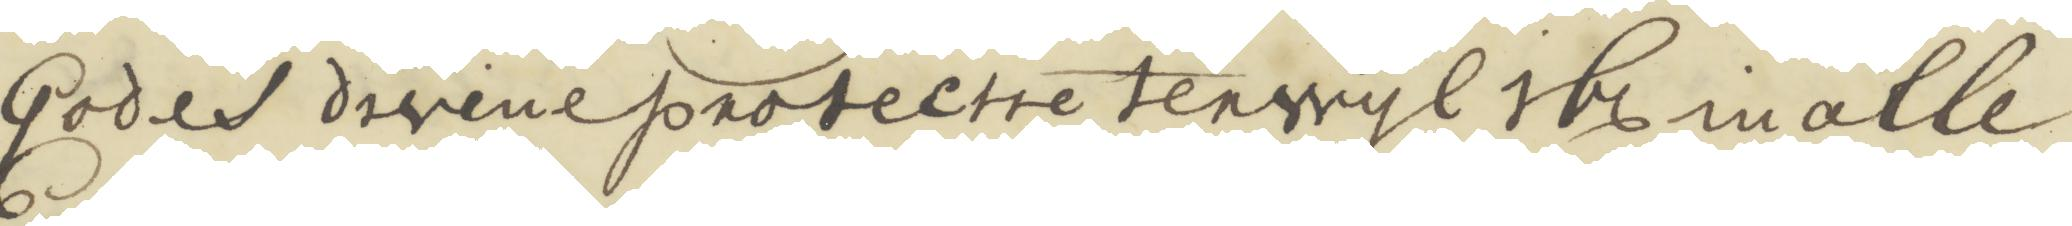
Godes divine protectie terwijl ik in alle
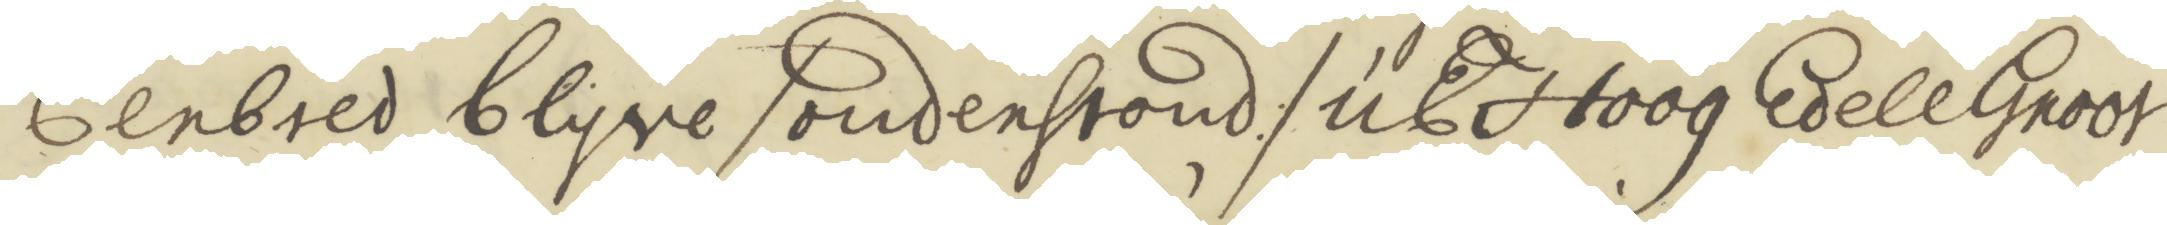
Eerbied blijve /onderstond:/ uE: Hoog Edele Groot
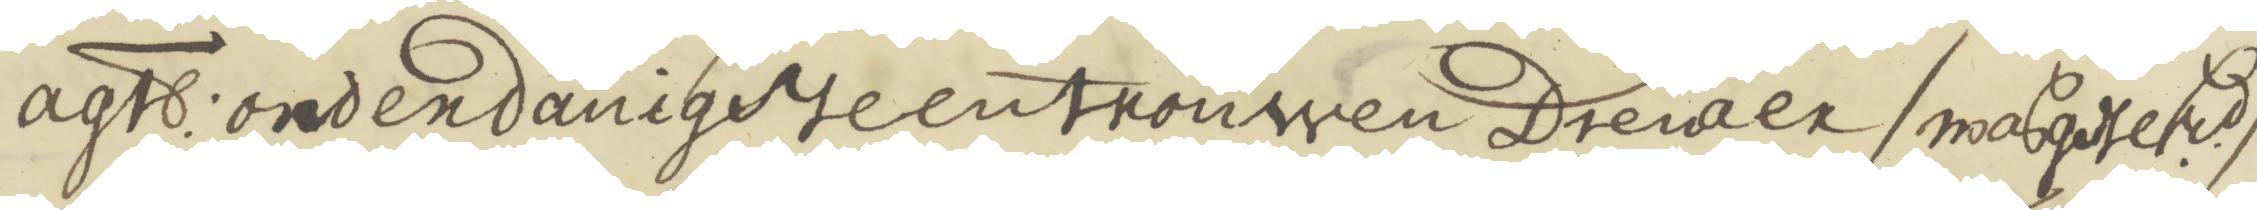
agtb: onderdanigste en trouwen Dienaer /was getek.d/
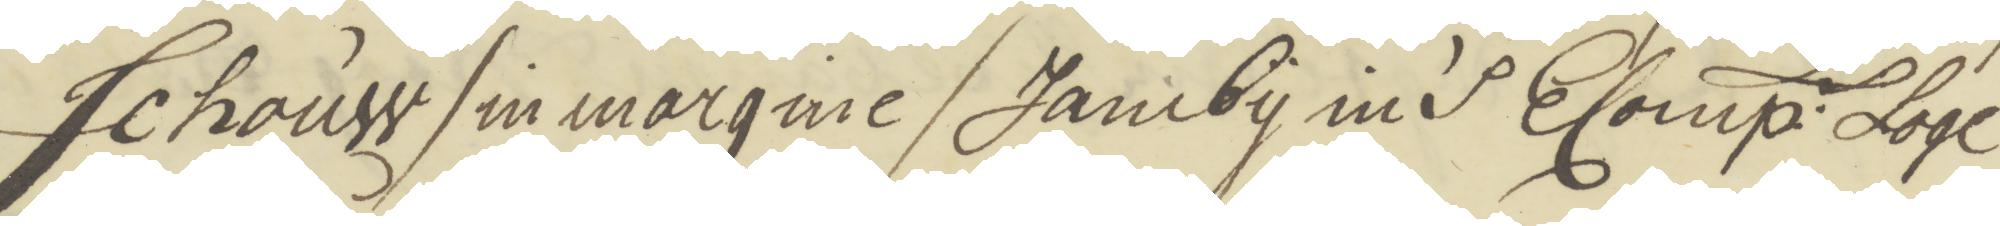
J„b Schouw /in margine/ Jambij in ’s EComp:s Loge
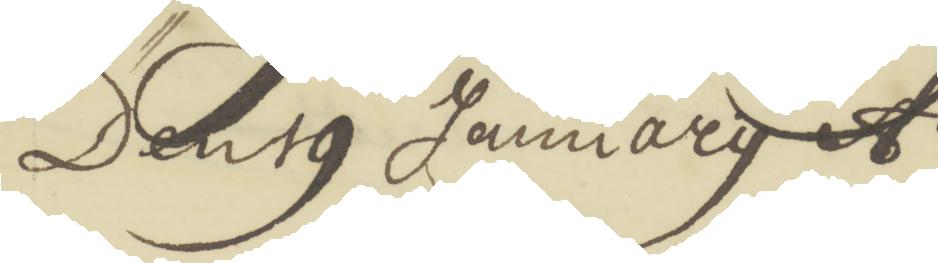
Den 19 Januarij Ao 1731.
